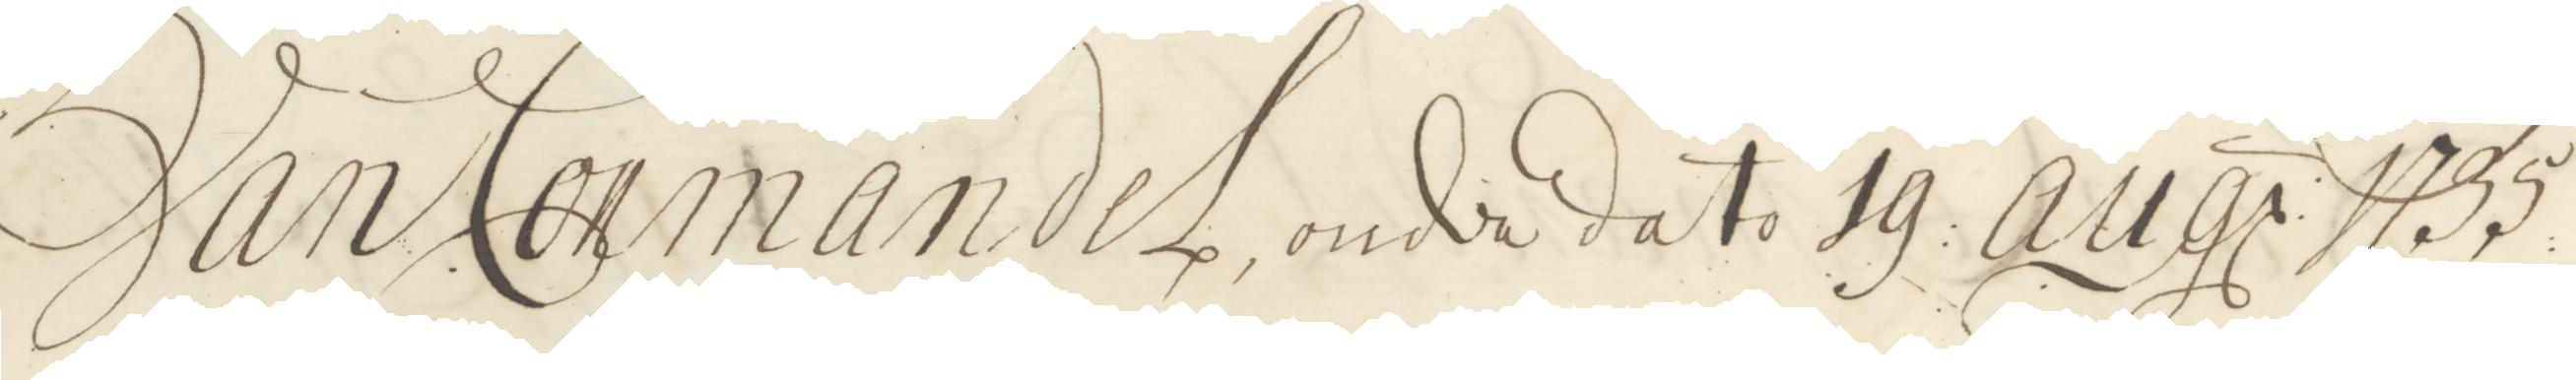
Van Cormandel, onder dato 19: augt: 1735:
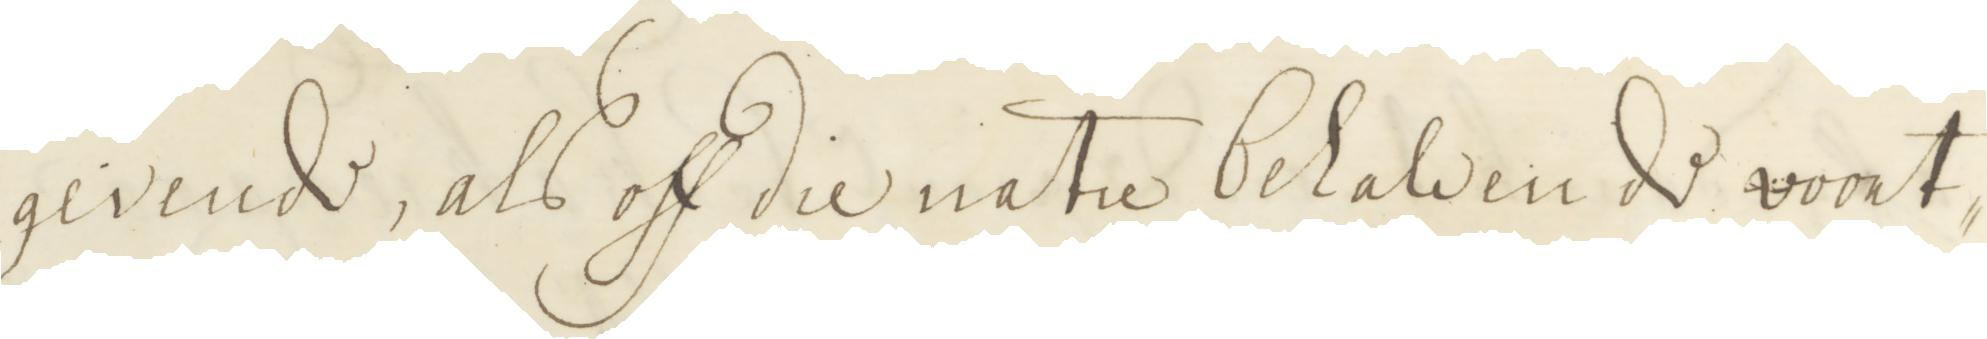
gevende, als off die natie behalven de voort
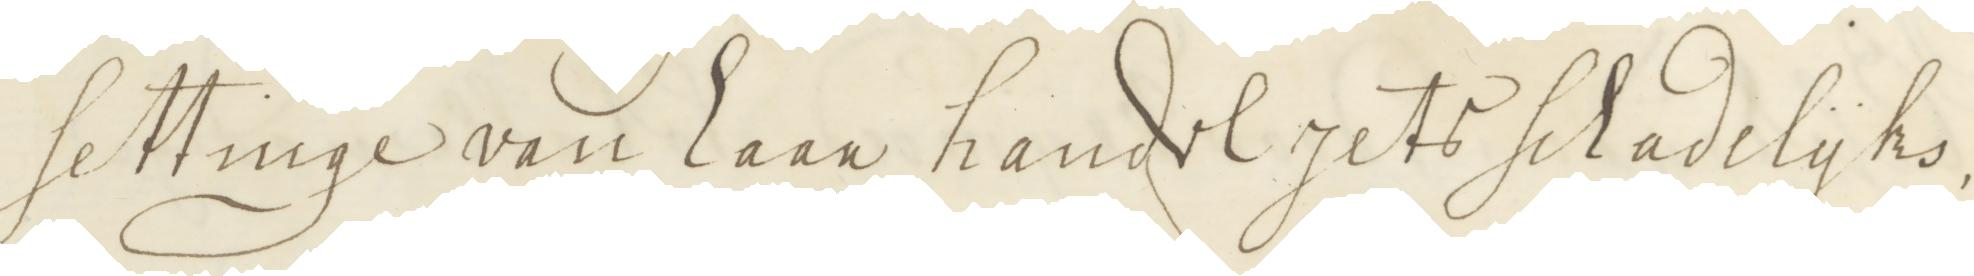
settinge van haar handel jets schadelijks,
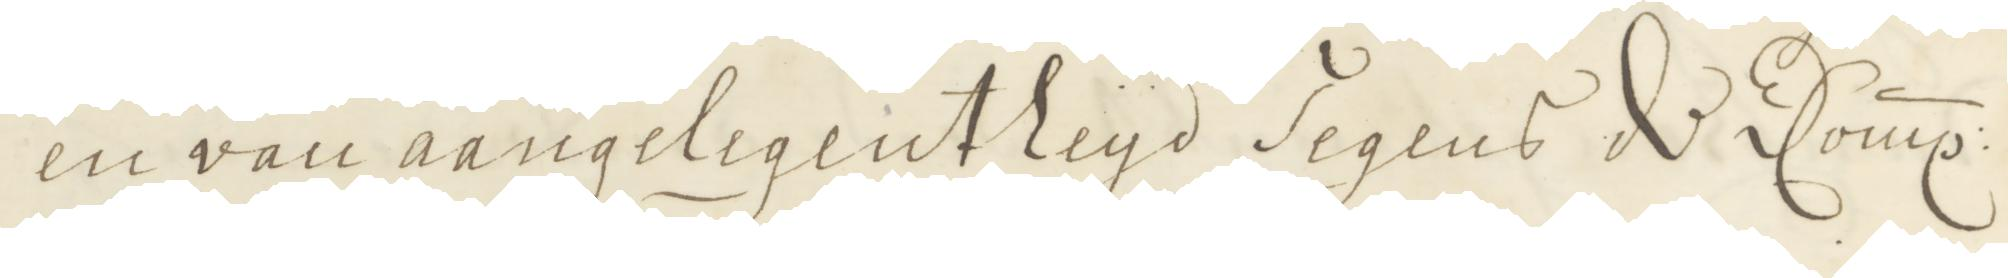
en van aangelegentheijd Tegens de EComp:
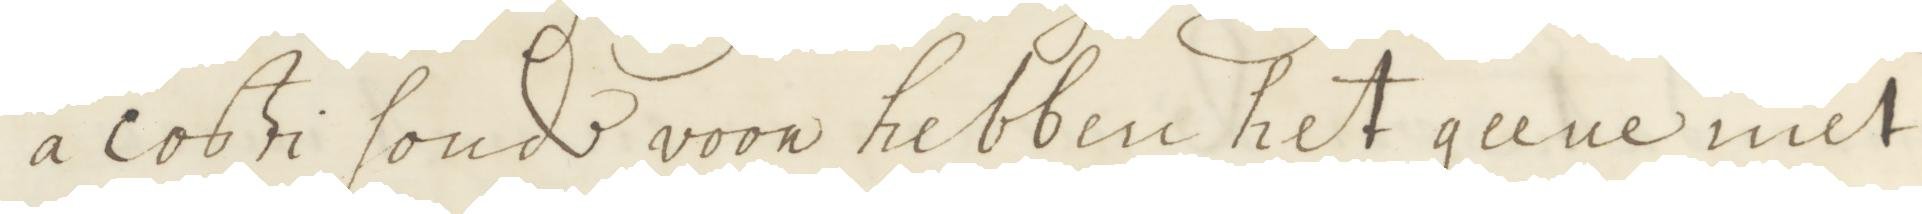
à costi soude voor hebben het geene niet
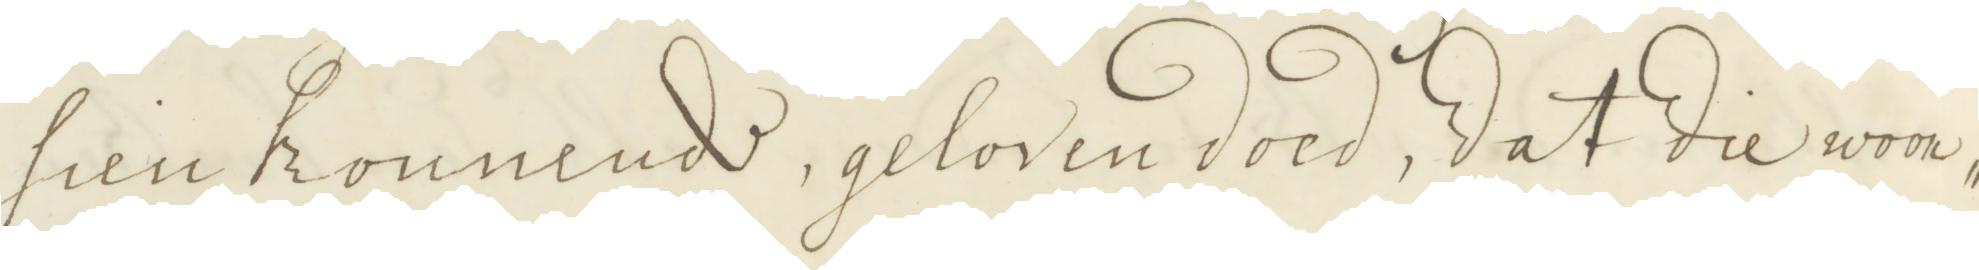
sien konnende, geloven doed, dat die woor„
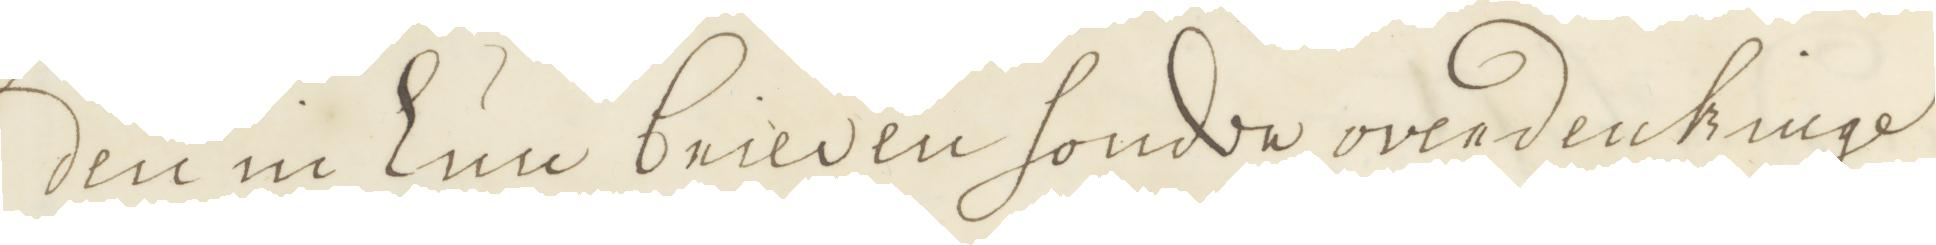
den in hun brieven sonder over denkinge
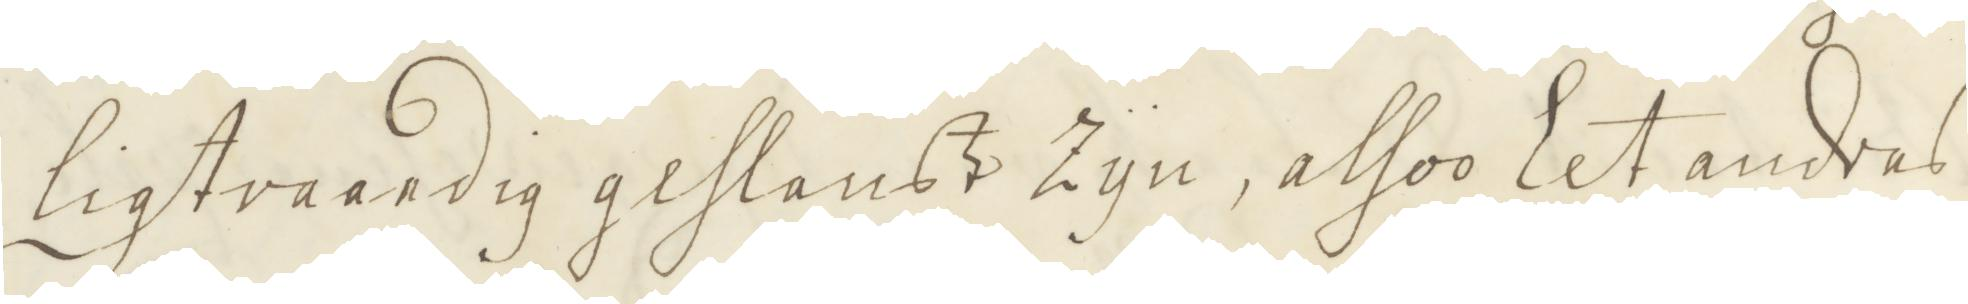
ligtvaardig geslanst zijn, alsoo het anders
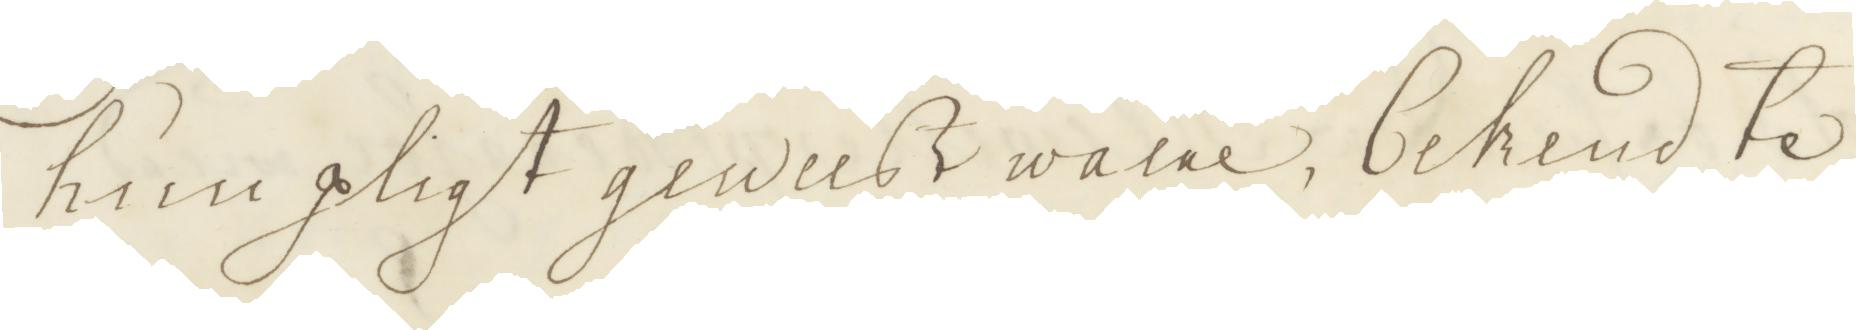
hun pligt geweest waere, bekend te
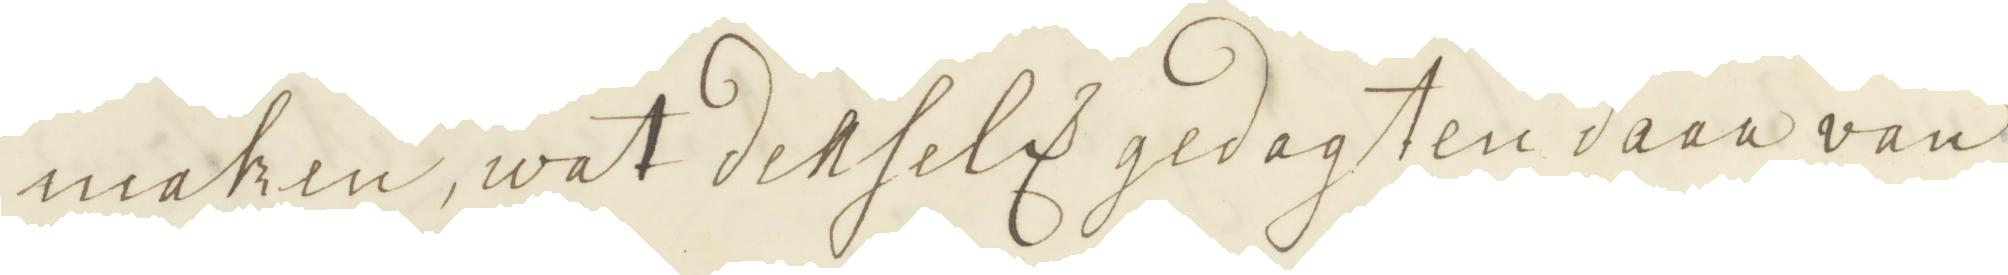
maken, wat derselver gedagten daar van
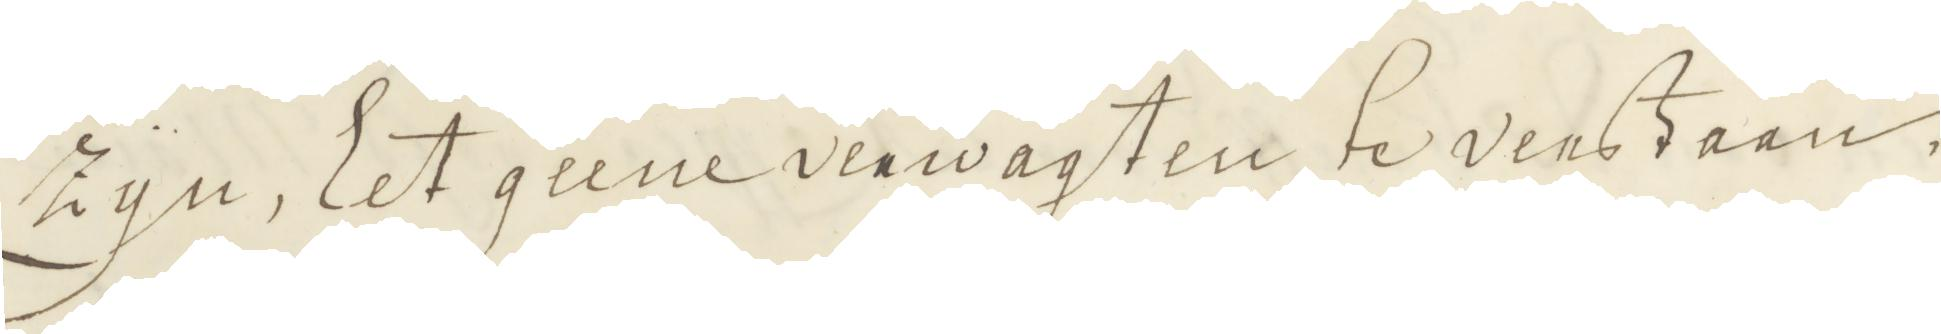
zijn, het geene verwagten te verstaan,
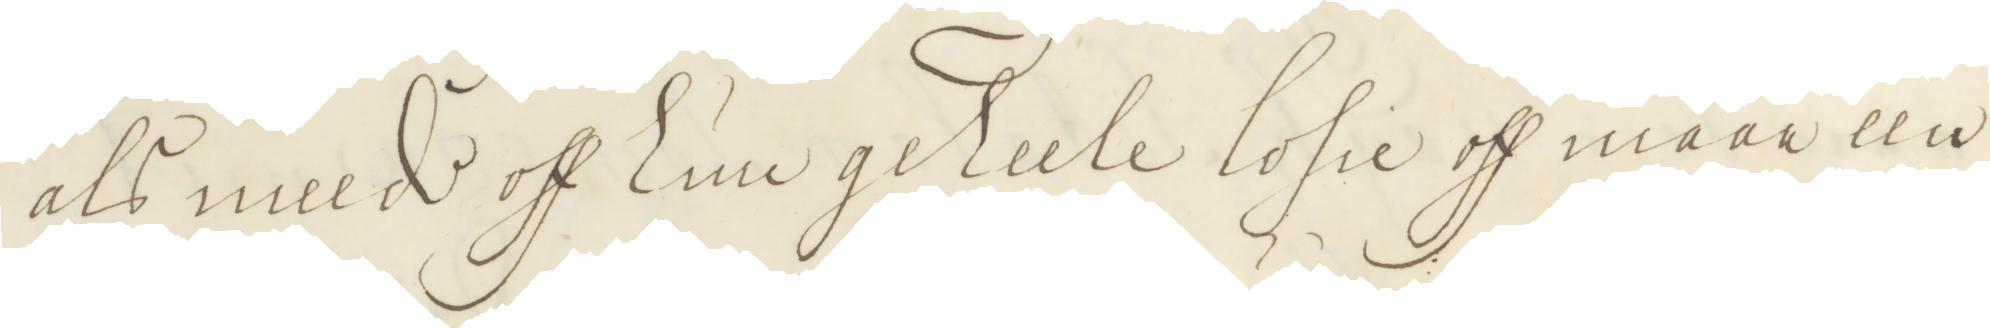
als meede off hun geheele losie off maar een
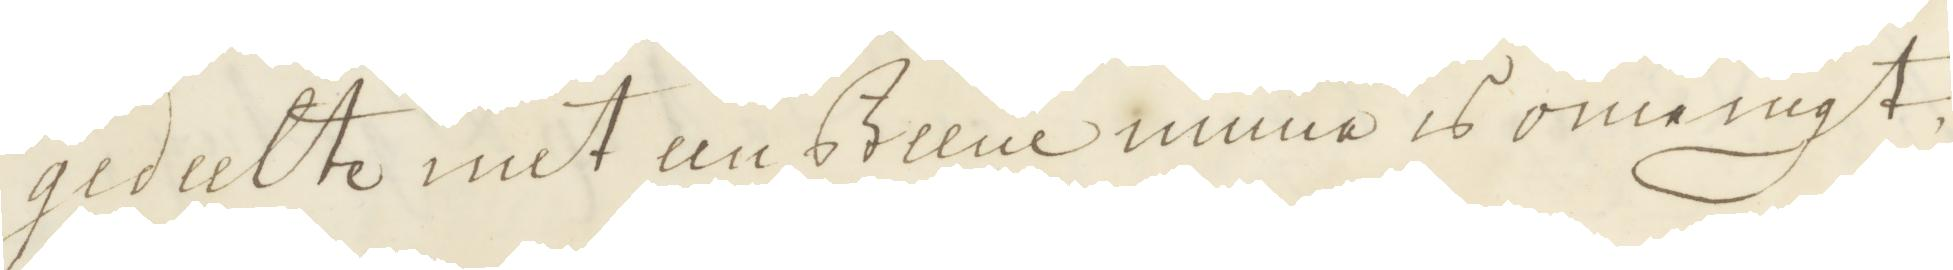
gedeelte met een steene muur is omringt
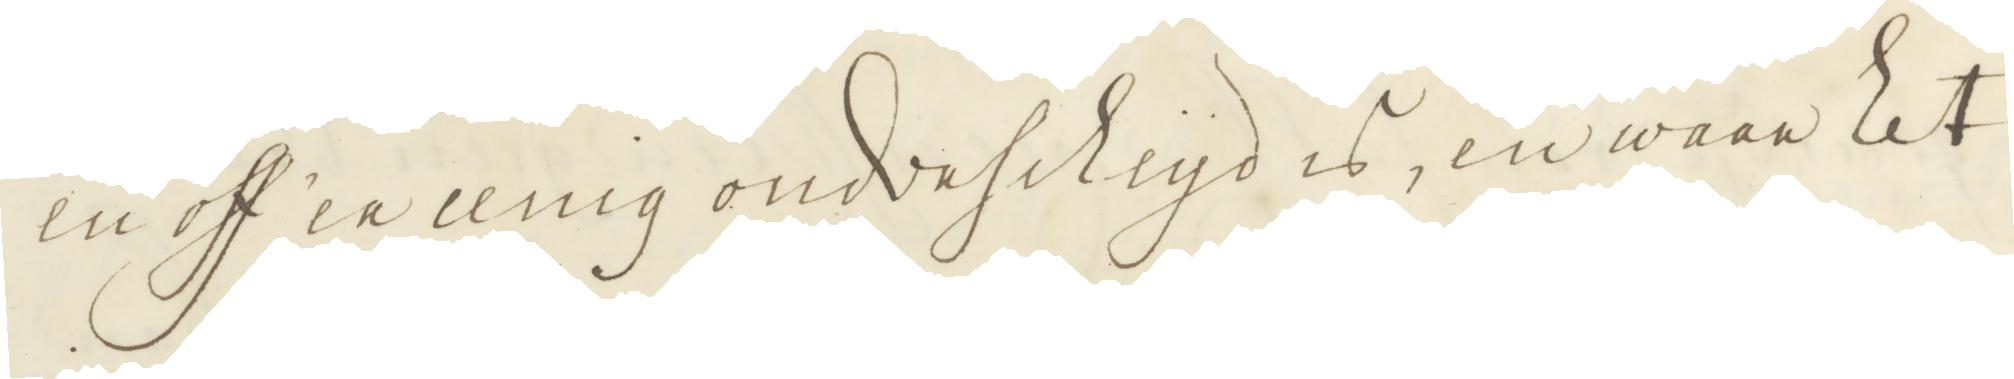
en off 'er eenig onderscheijd is, en waar het
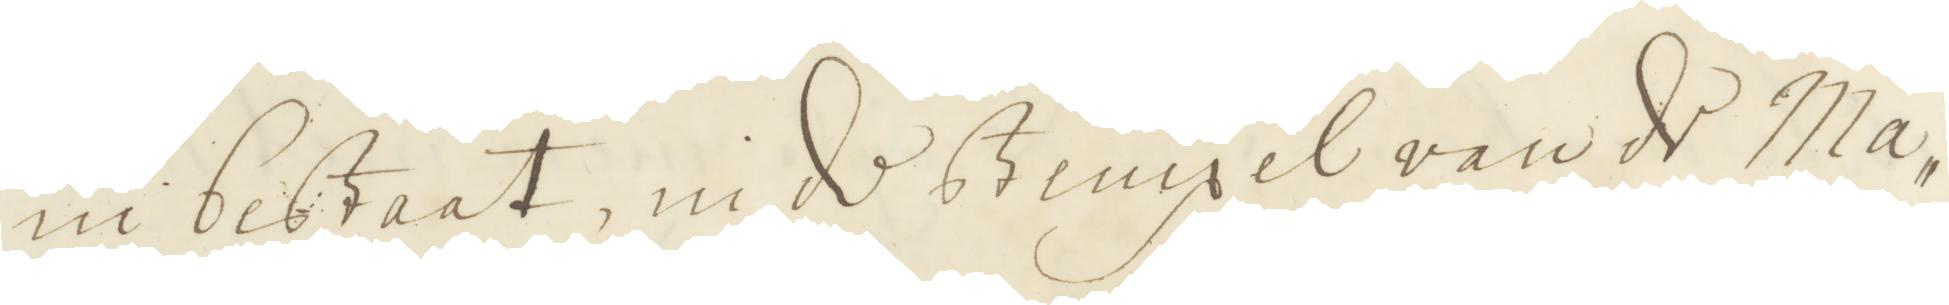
in bestaat, in de stempel van de Ma„
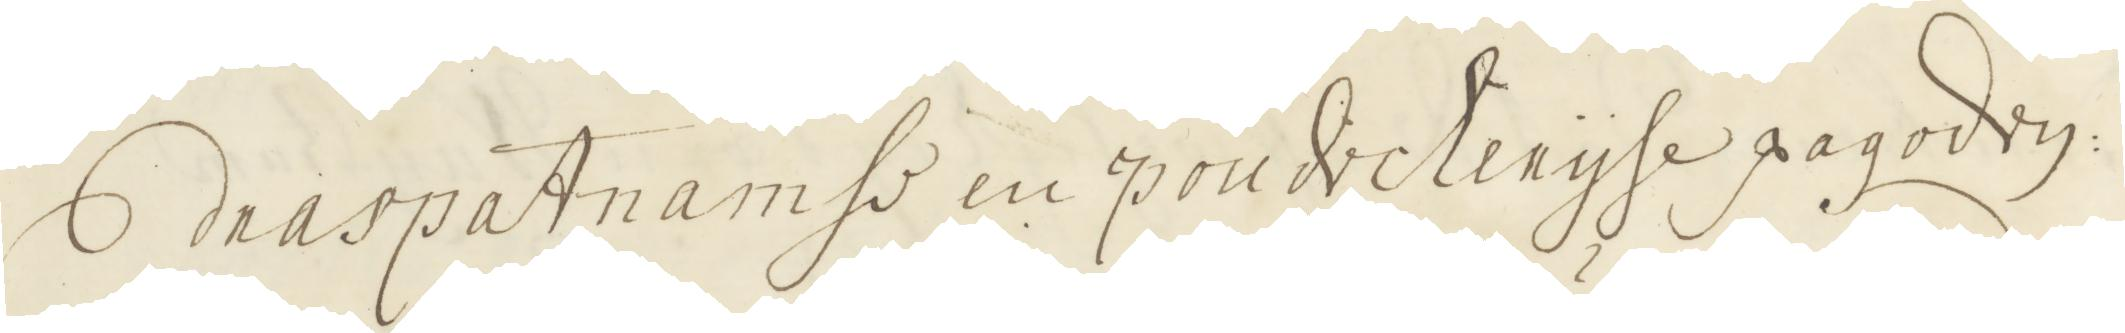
draspatnamse en pondecherijse pagoden:
